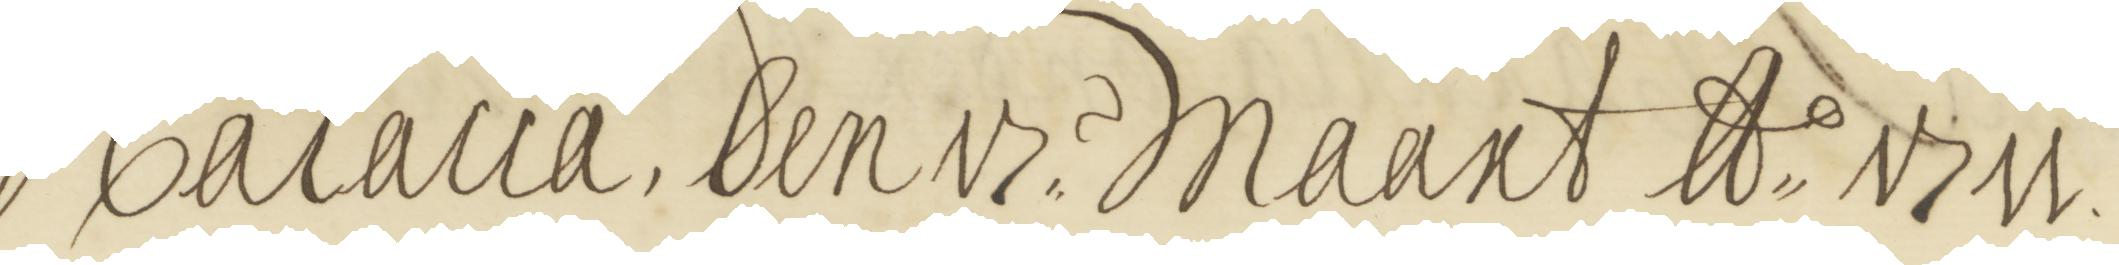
Malacca, den 17„' Maart A„o 1711.
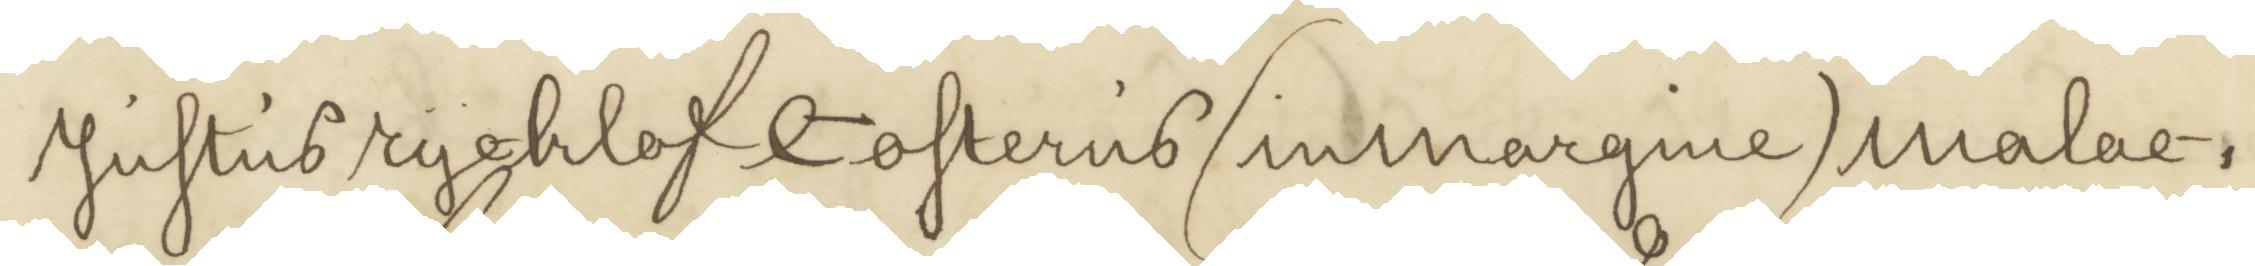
Justus rijeklof Costerus (in margine) malac„
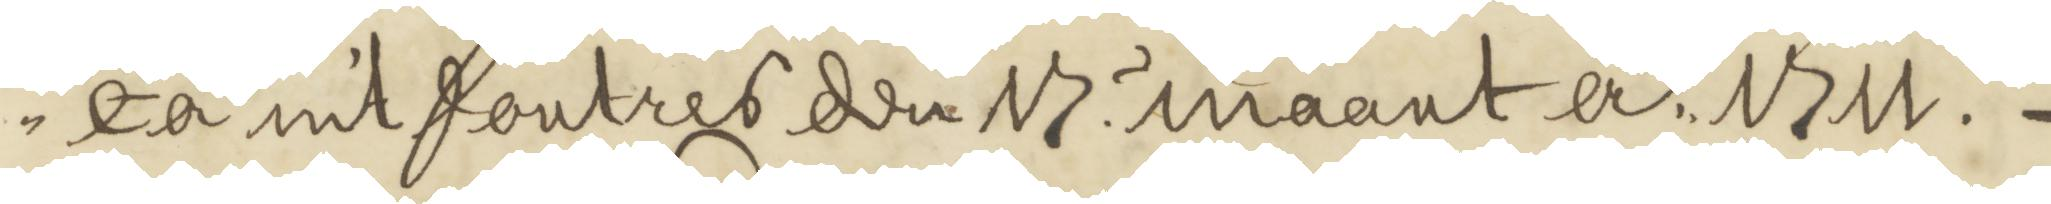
„ca in 't fortres den 17.' maart a„o 1711. —
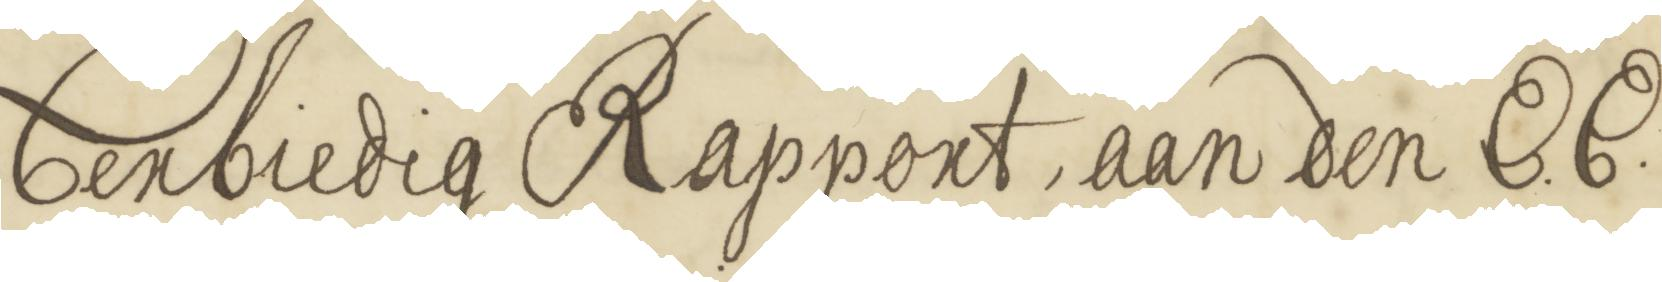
Eerbiedig Rapport, aan den E. E.
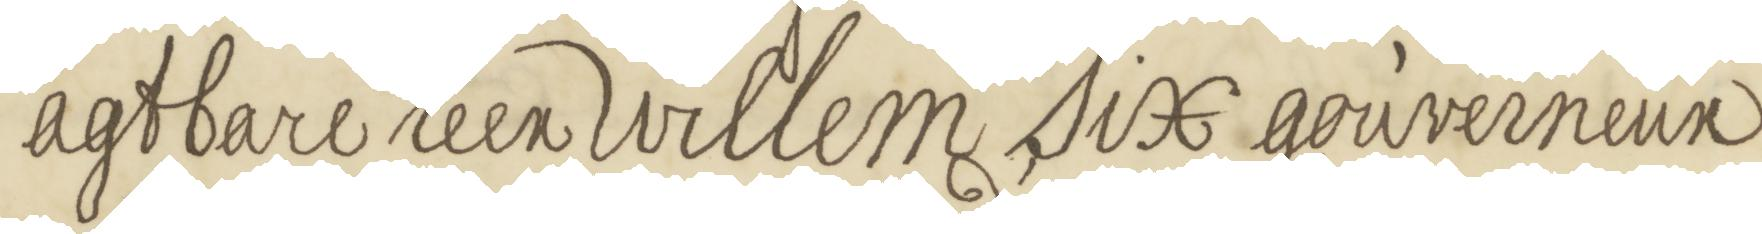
agtbare heer Willem Six gouverneur
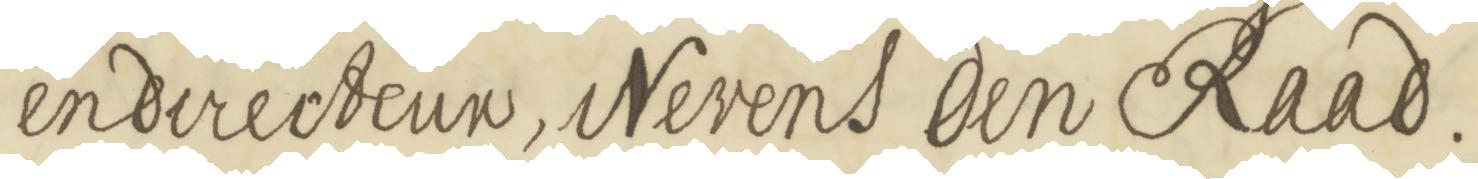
en directeur, Nevens den Raad.
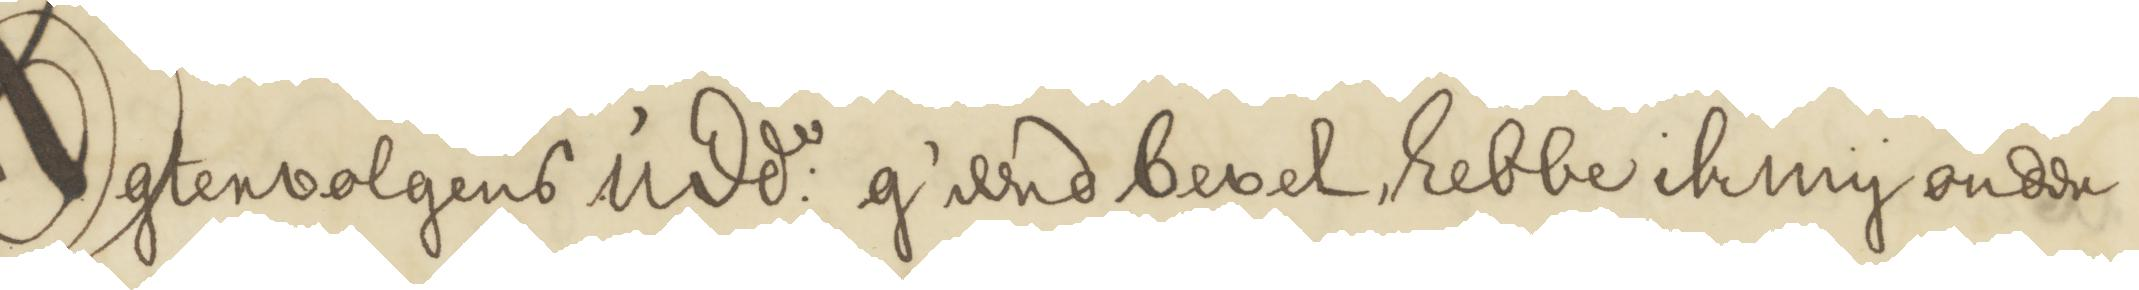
Agtervolgens u Ed:e g’eene bevel, hebbe ik mij onder
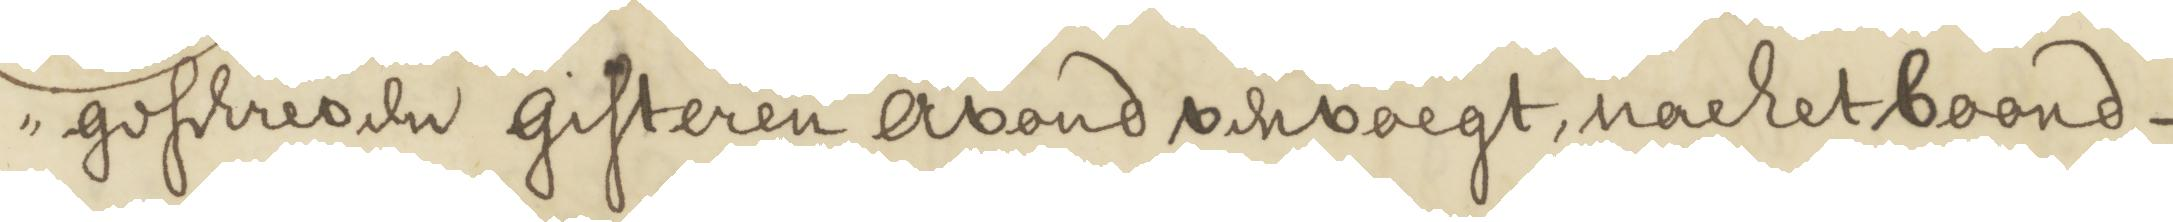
„geschreven gisteren avond vervoegt, nae het boord
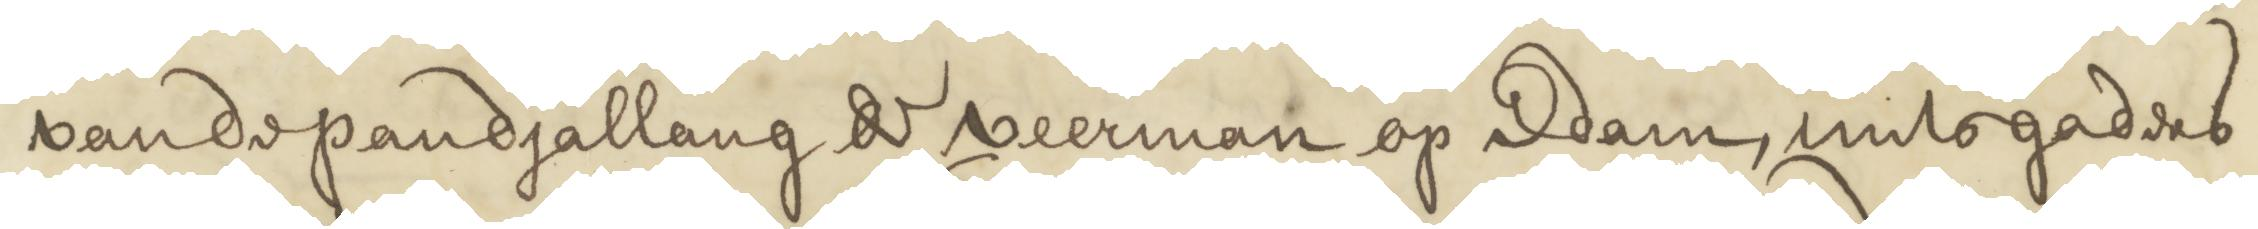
van de pandjallang de veerman op Edam, mitsgaders
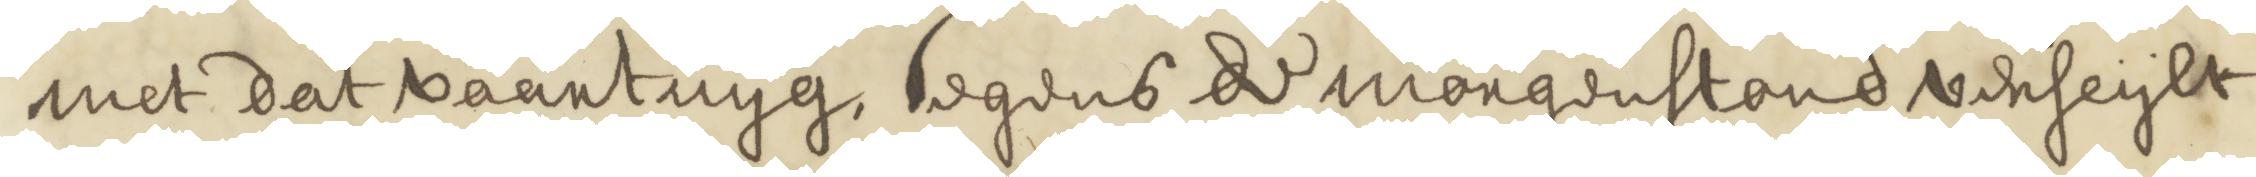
met dat vaartuijg, tegens de morgenstond verseijlt
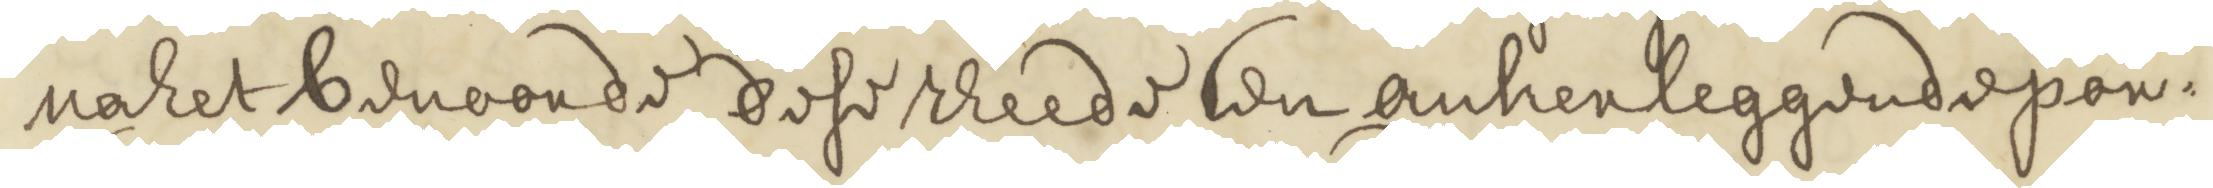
na het benoorde dese rheede ten anher leggende por„
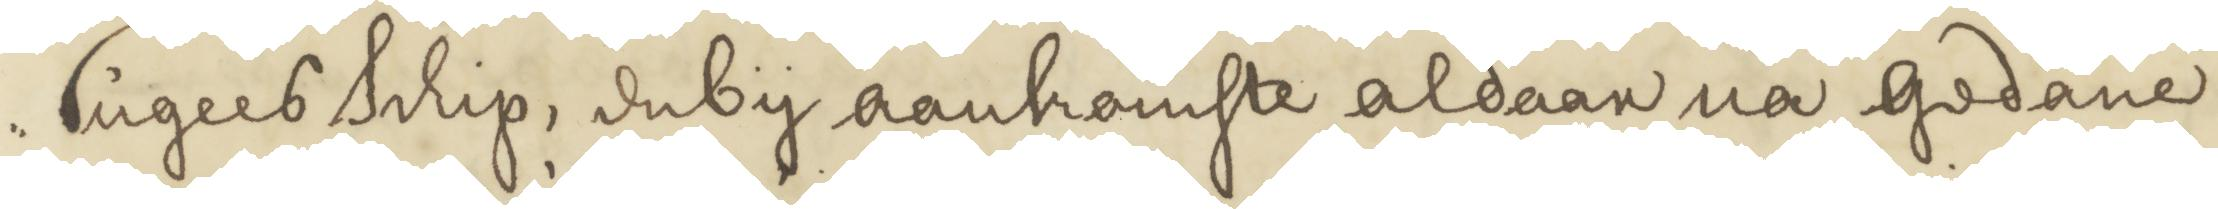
„tugees schip, en bij aankomste aldaar na gedane
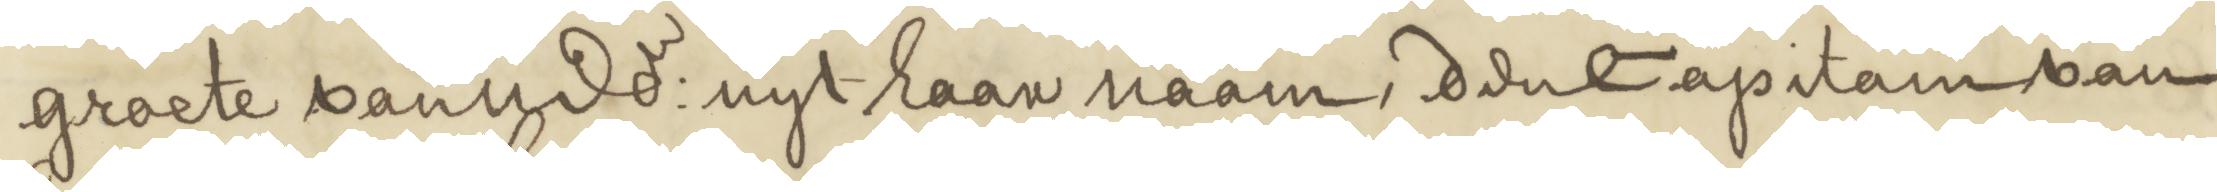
groete van U Ed:e uijt haar naam, den Capitain van
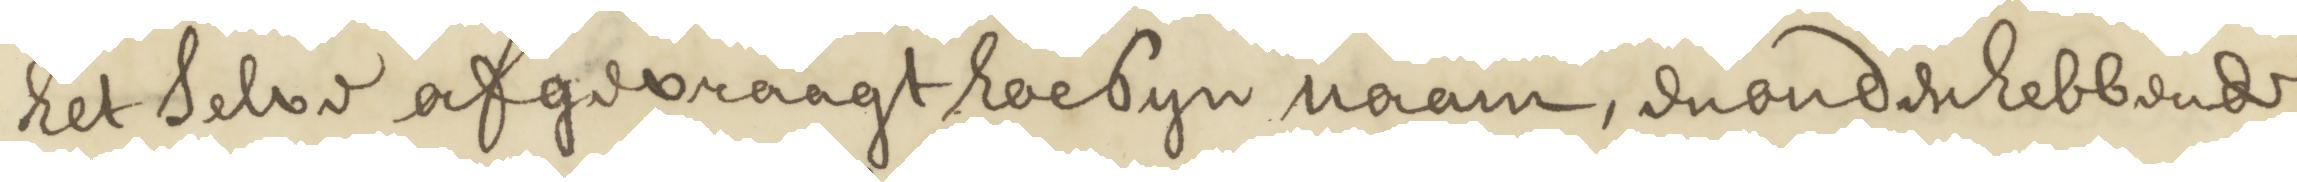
het selve afgevraagt hoe sijn naam, en onderhebbende
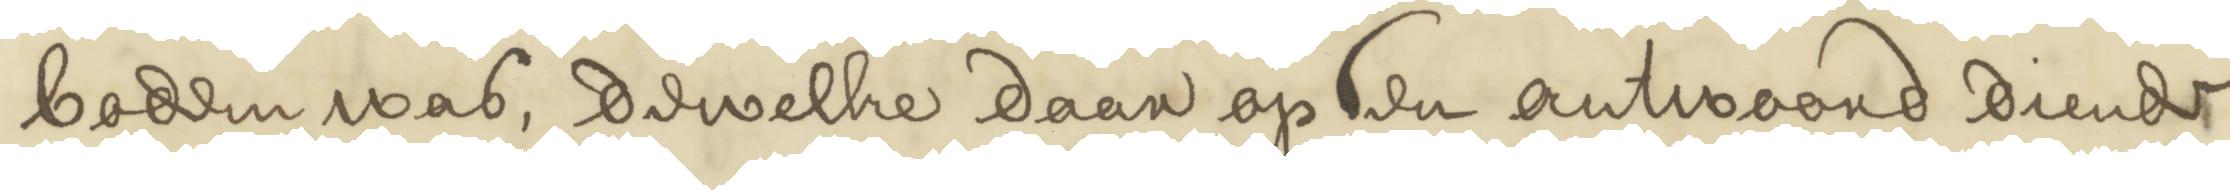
bodem was, dewelke daar op ten antwoord diende
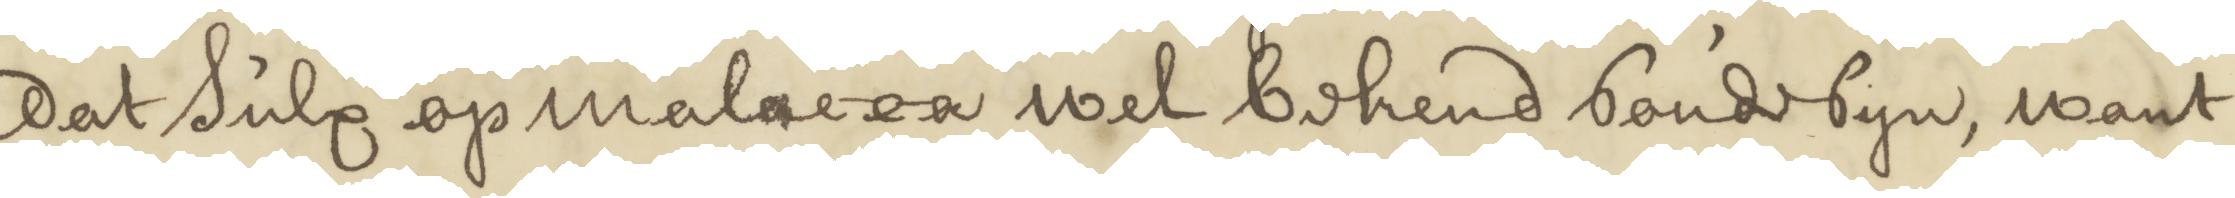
dat sulx op malacca wel bekend soude sijn, want
